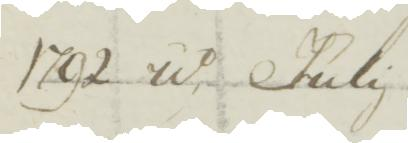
1792 u„o Iulij
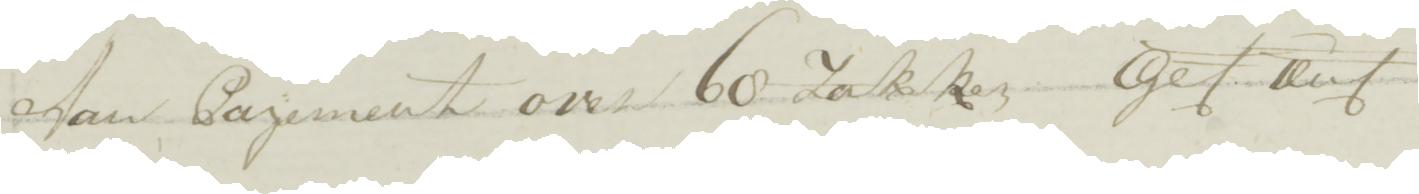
Aan Paijement over 68 zakken gec duc
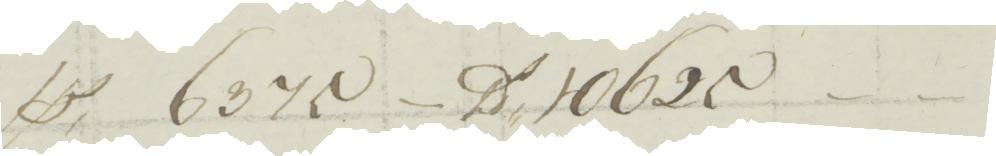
p„s 6375 — rd„s 10625 — —
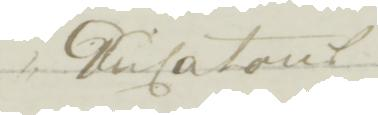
„ducatons
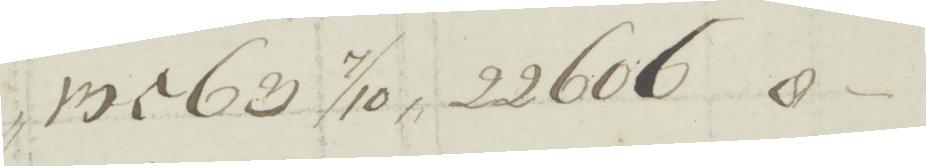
„13563 7/10 „ 22606 8 —
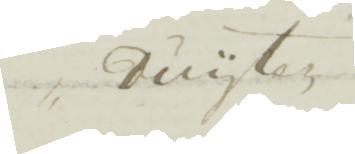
„ duijten,
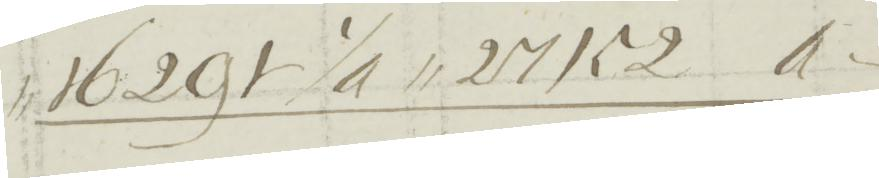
„16291¼ „ 27152 4 —
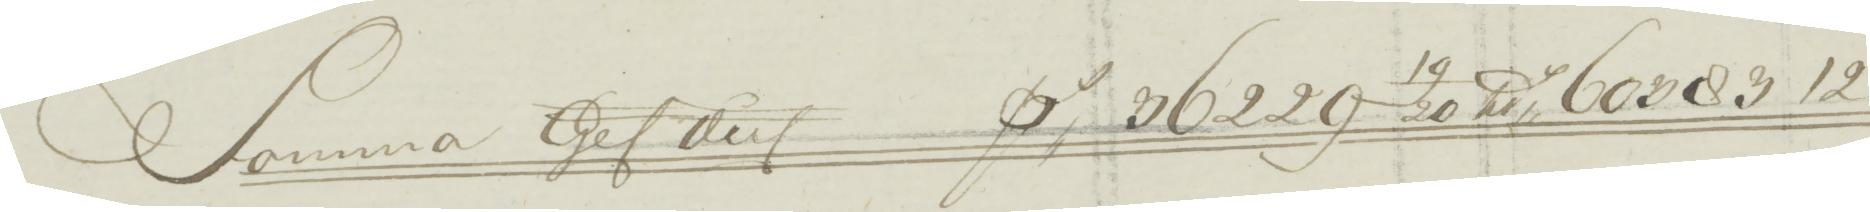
Somma Gec duc p„s 36229 19/20 rd„s 60383 12
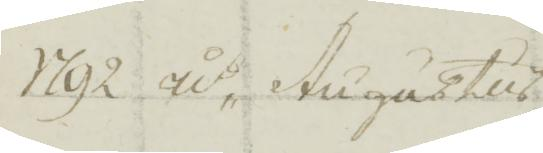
1792 u„o Augustus
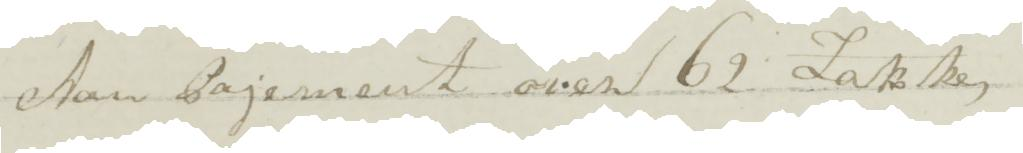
Aan Pajement over 62: zakken
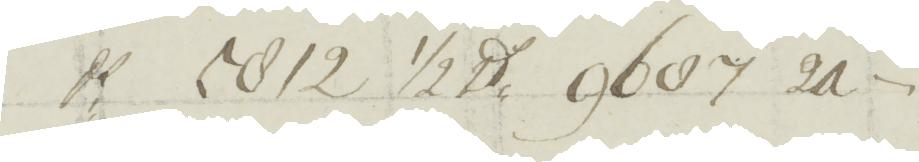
d„s 5812 ½ rd„s 9687 24 —
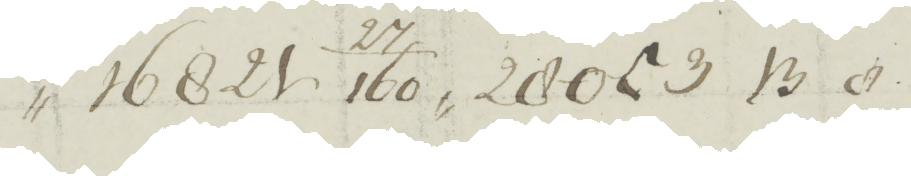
„ 16821 27/160 „ 28053 13 8
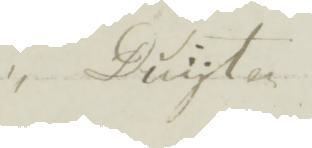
„ Duijten
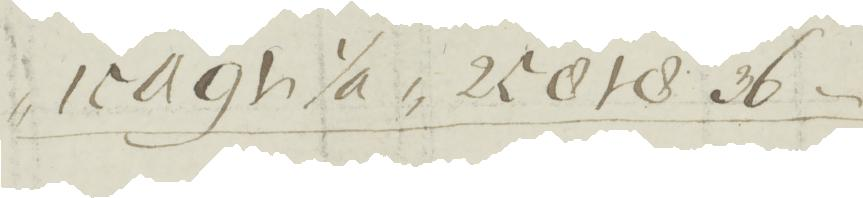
„15491¼ „ 25818 36 —
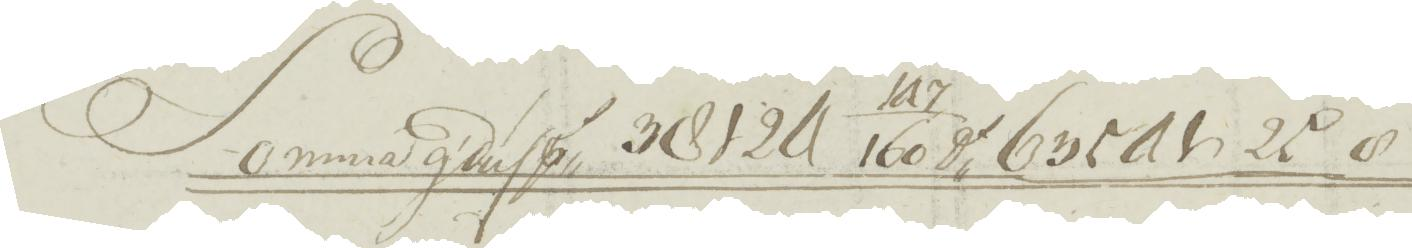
Somma g'duc p„s 38124 147/160 d„s 63541 25 8
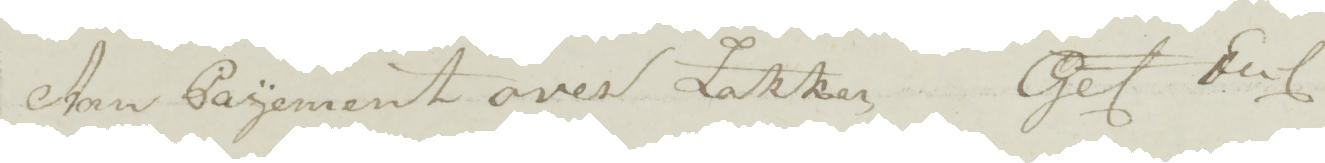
Aan Paijement over zakken Gec duc
